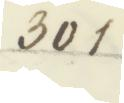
301
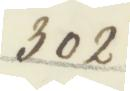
302
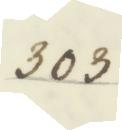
303
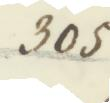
305
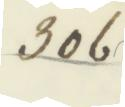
306
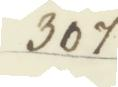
307
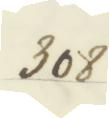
308
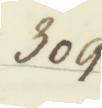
309
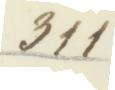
311
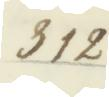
312
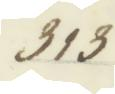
313
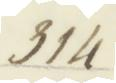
314
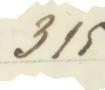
315
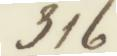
316
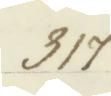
317
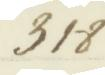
318
